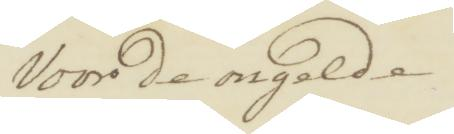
voor de ongelde
